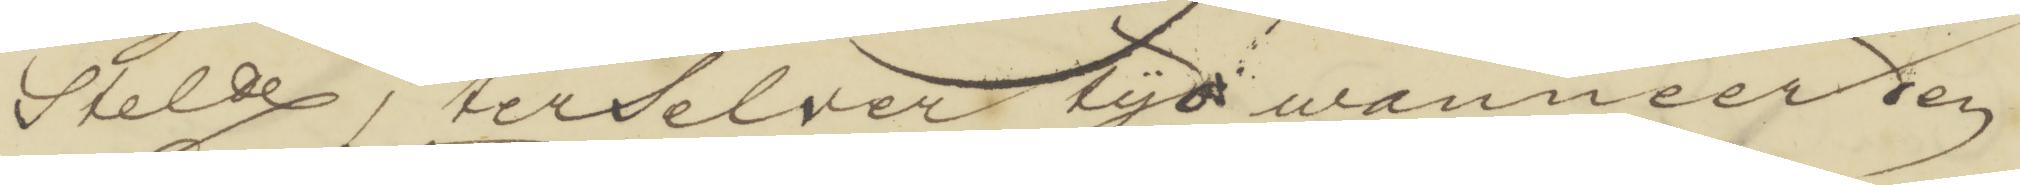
stelde, terselver tijd wanneer den
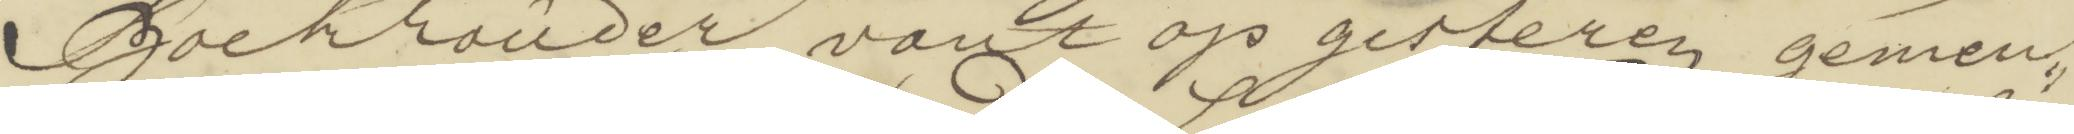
Boekhouder van’t op gisteren gemen„
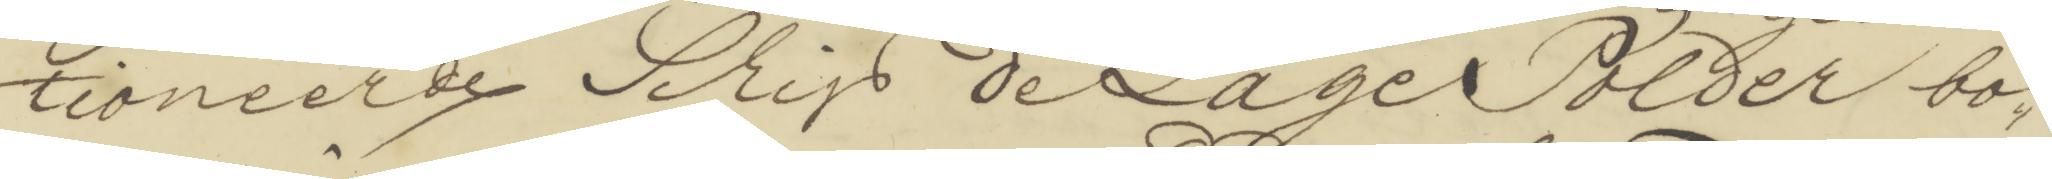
tioneerde Schip de Lage Polder bo„
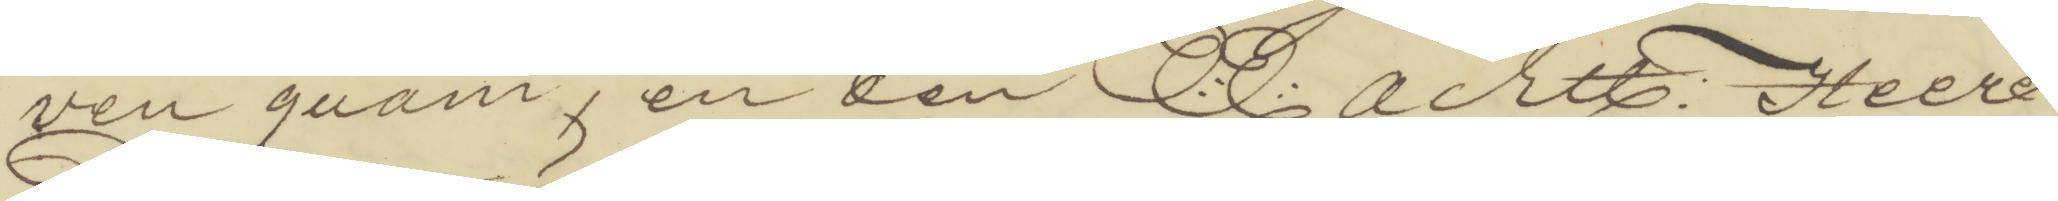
ven quam, en den EE: achtb: Heere
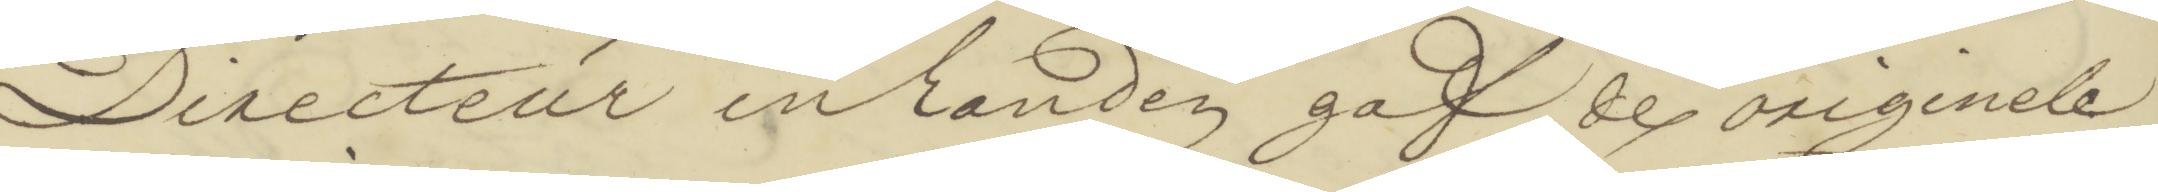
Directeur en handen gaf de originele
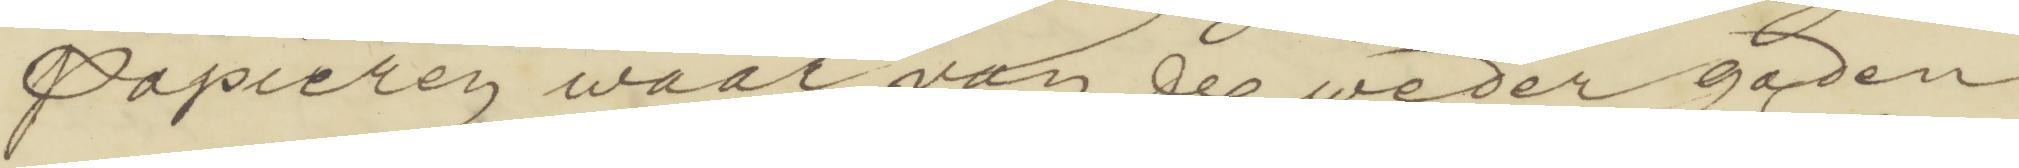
Papieren waar van de weder gaden
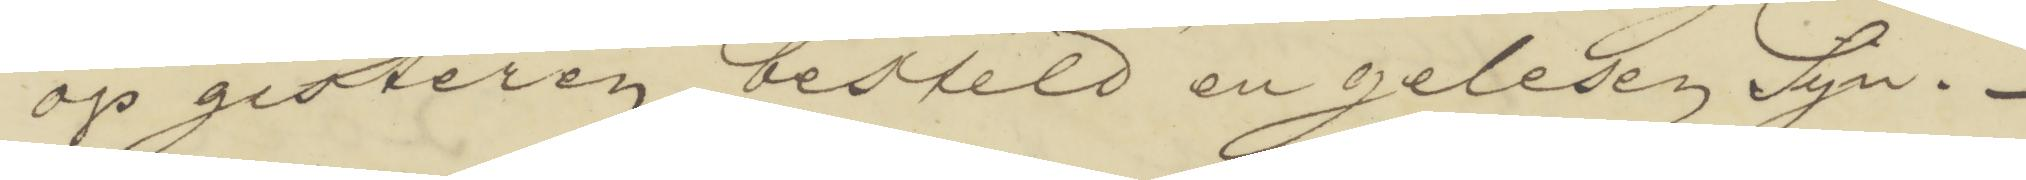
op gisteren besteld en gelesen Sijn.
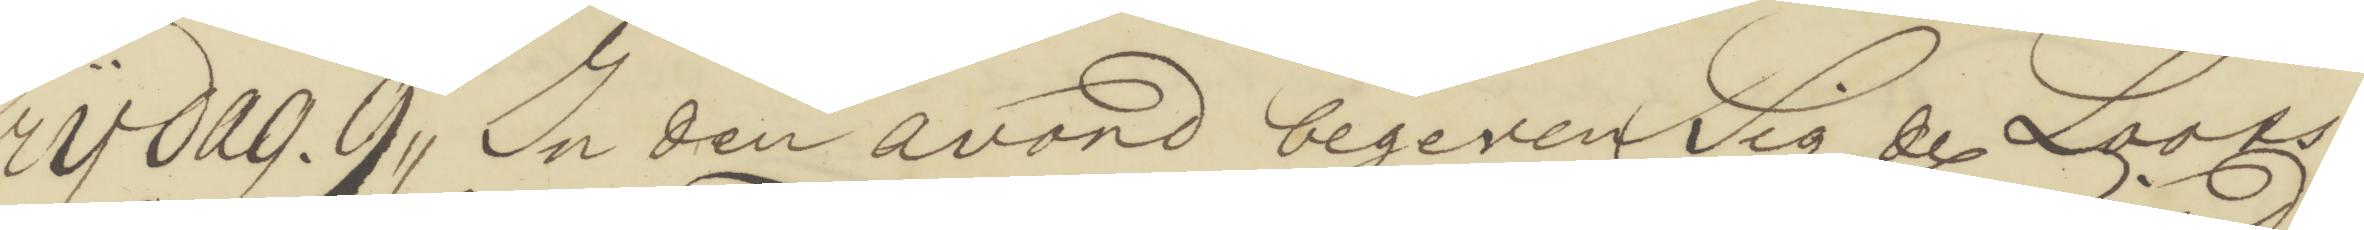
Vrijdag. 9„' In den avond begeven Sig de Loots
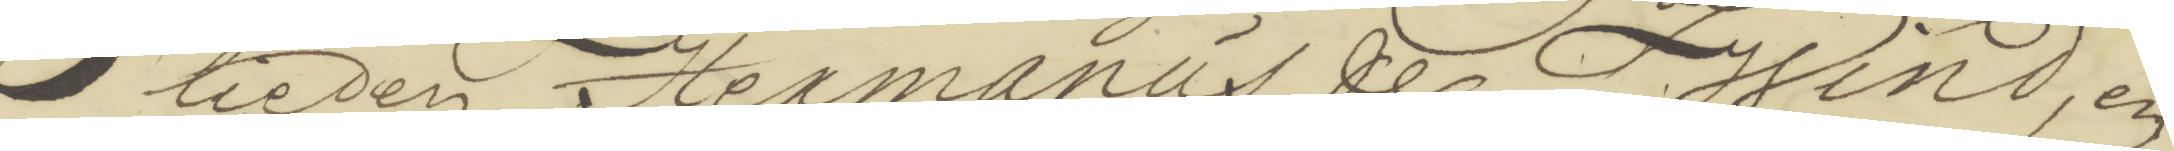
lieden Hermanus de Wind, en
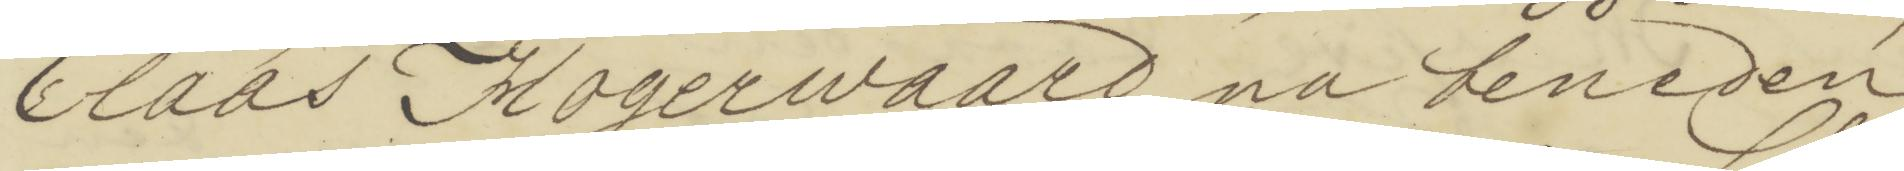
Claas Hogerwaard na beneden
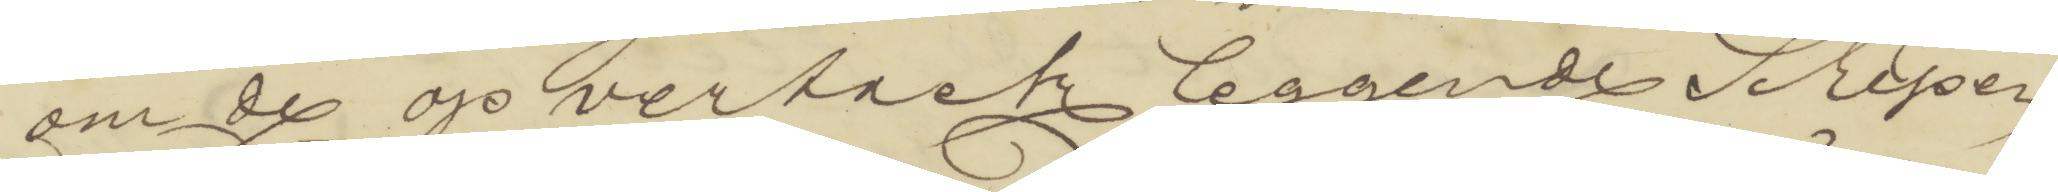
om de op vertrek leggende Schepen
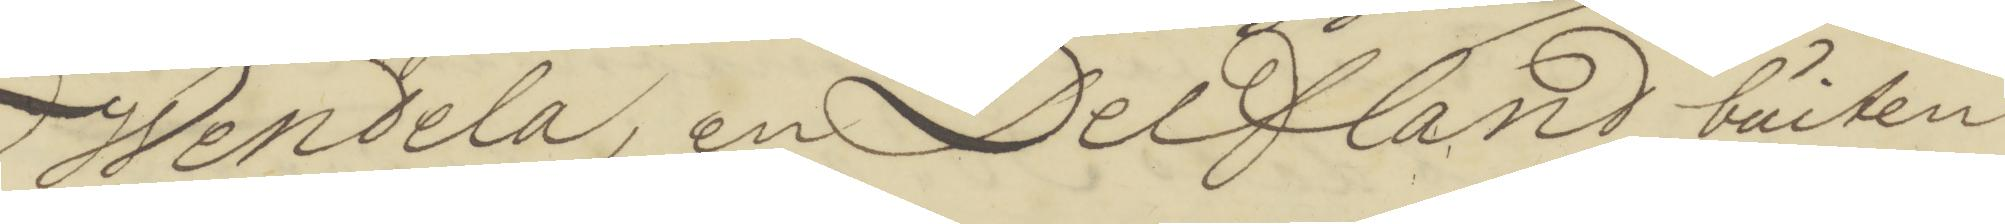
Wendela, en Delfland buiten
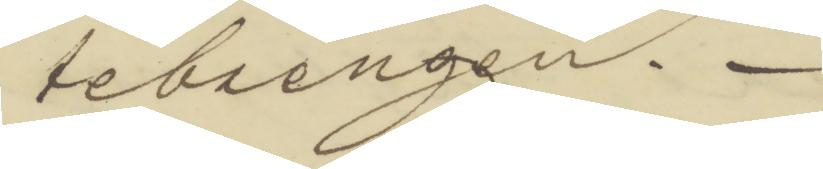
tebrengen.
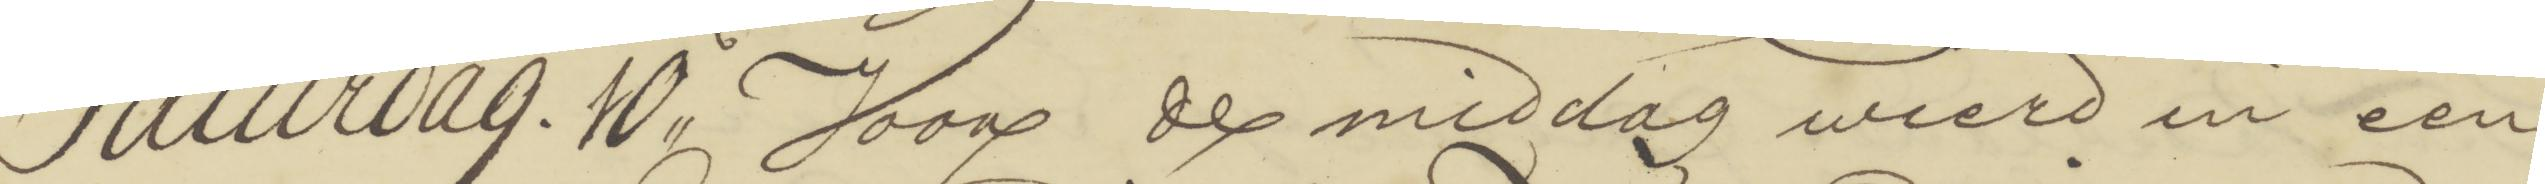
Saturdag.10„' Voor de middag wierd in een
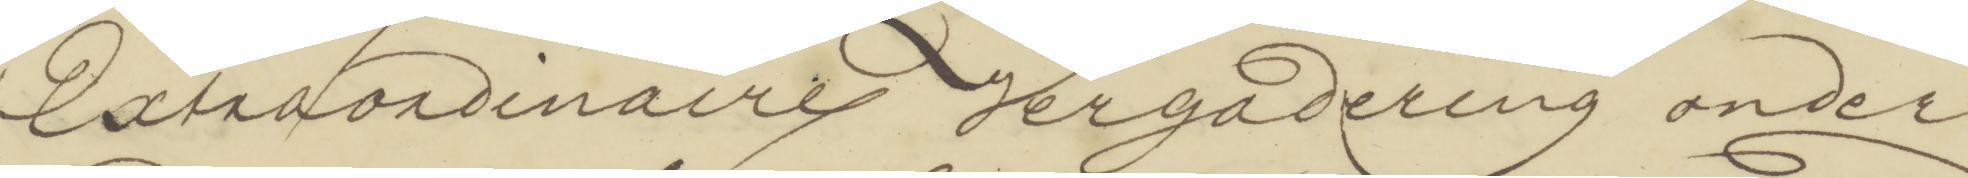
Extroordinaire vergadering onder
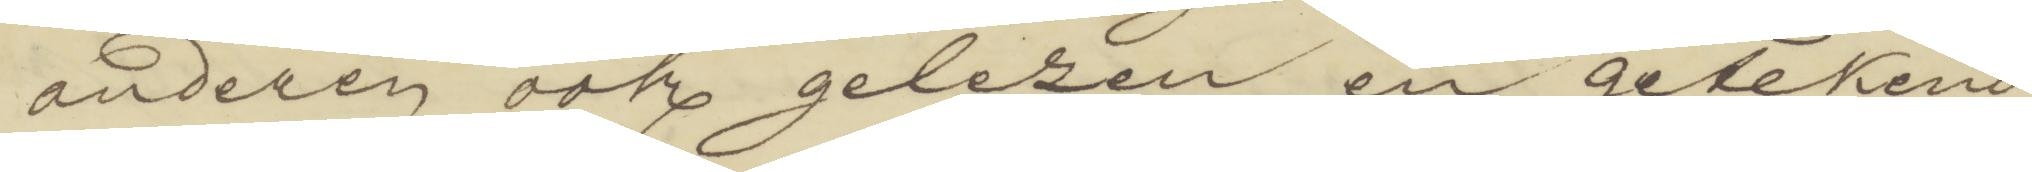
anderen ook gelezen en getekend
